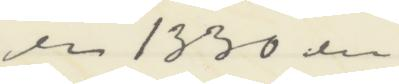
en 1330 en
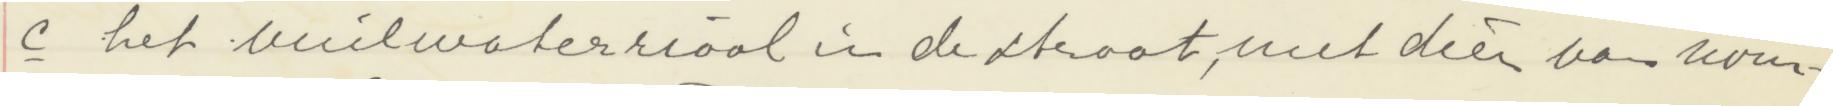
c het vuilwaterriool in de straat, met dien van nom-
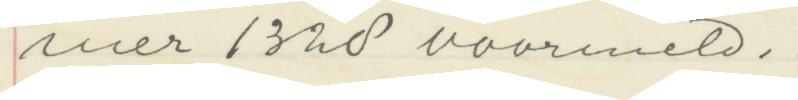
mer 1328 voormeld.
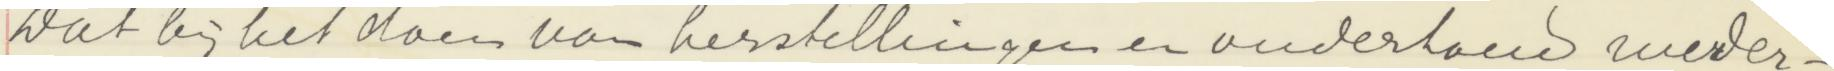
Dat bij het doen van herstellingen en onderhoud weder-
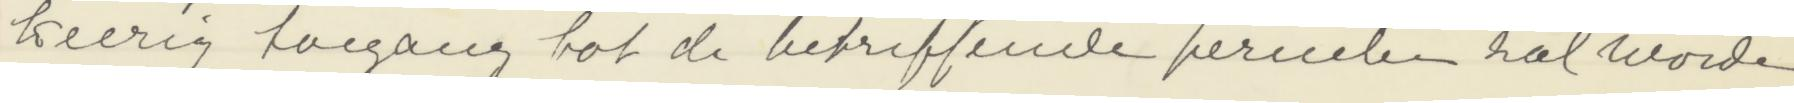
keerig toegang tot de betreffende perceelen zal worden
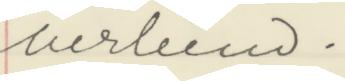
verleend.
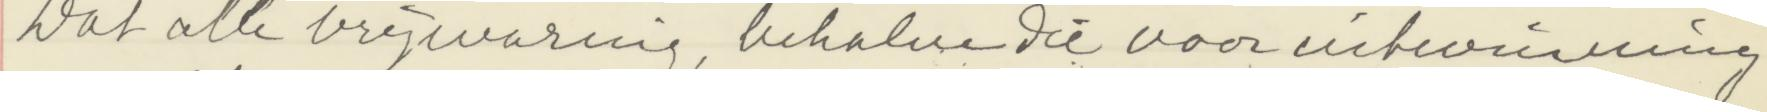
Dat alle vrijwaring, behale die voor uitwinning
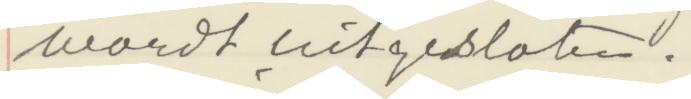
wordt uitgesloten.
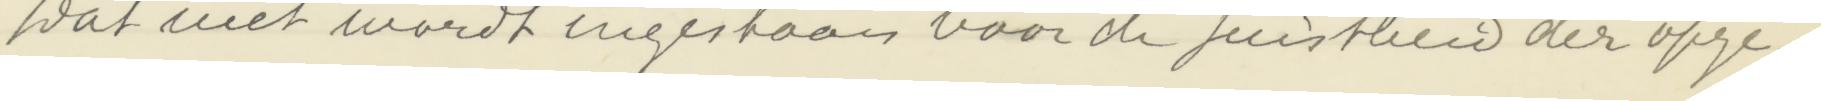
Dat niet wordt ingestaan voor de juistheid der opge-
